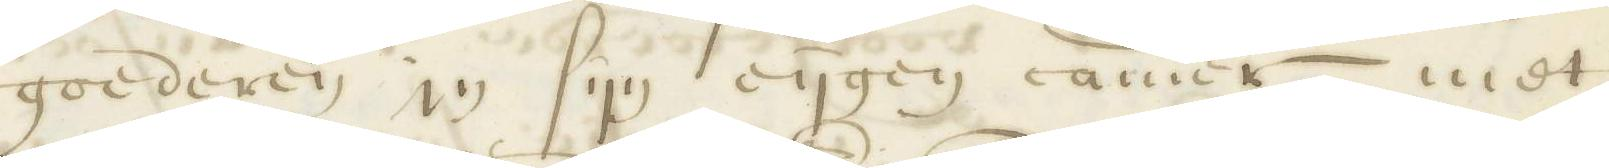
goederen in sijn eijgen camer met
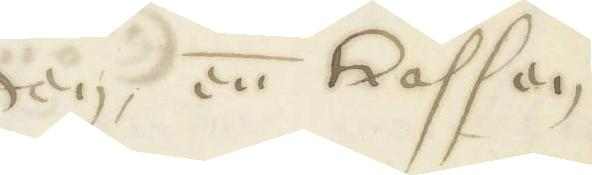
ten, en kassen
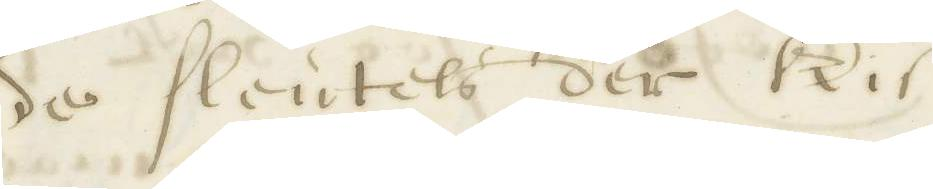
de sleutels der kis
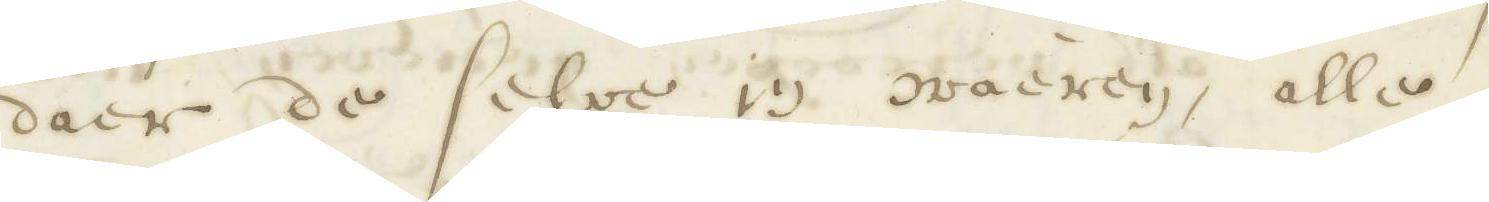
daer de selve in waeren, alle
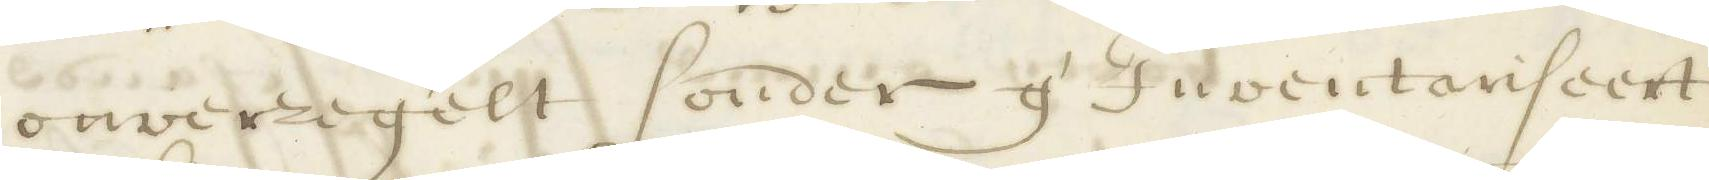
onverzegelt sonder g’jnventariseert
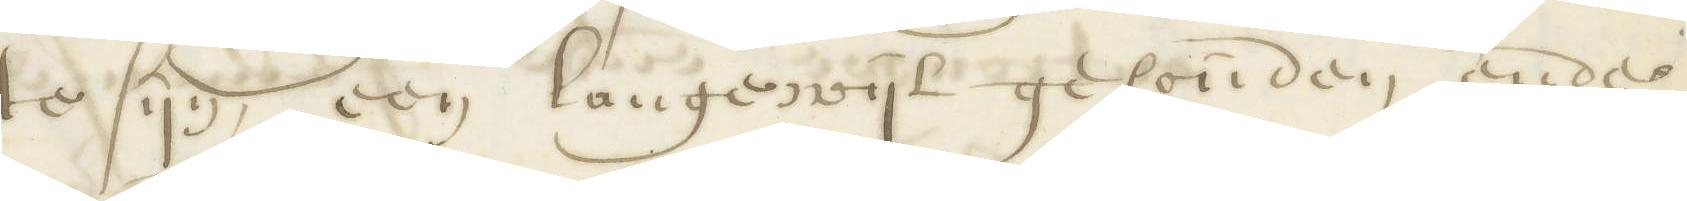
te sijn, een langewijl gehouden ende
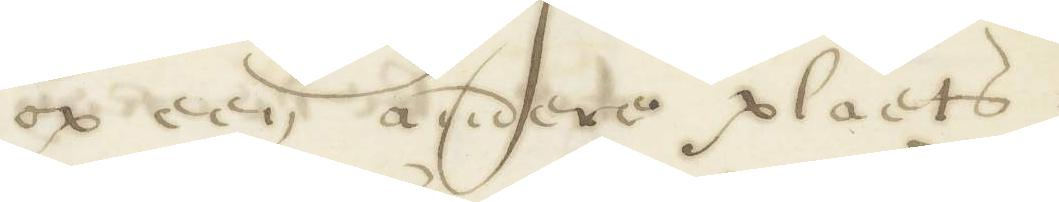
op een andere plaets
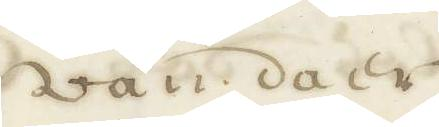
van daer
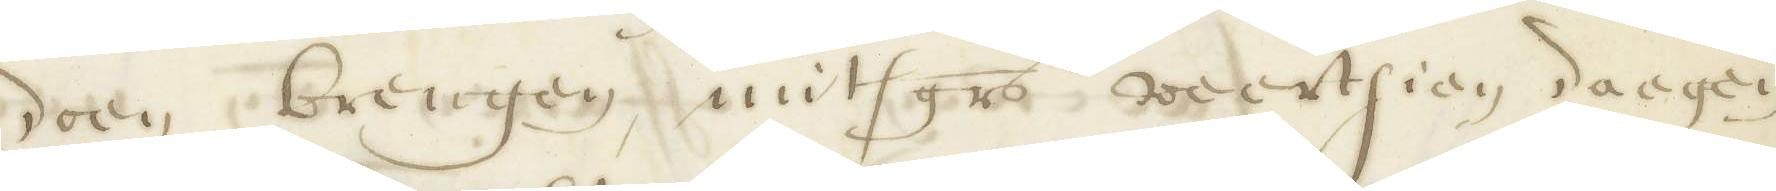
doen brengen, mitsgrs veerthien daegen
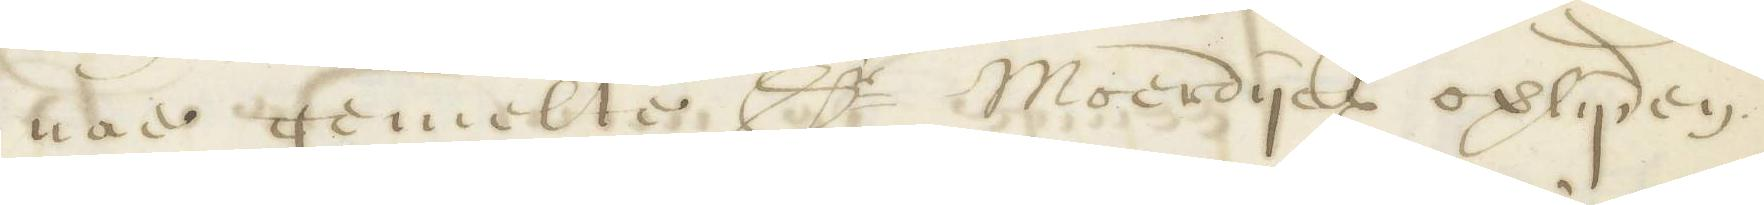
nae gemelten H=r Moerdijk overlyden.
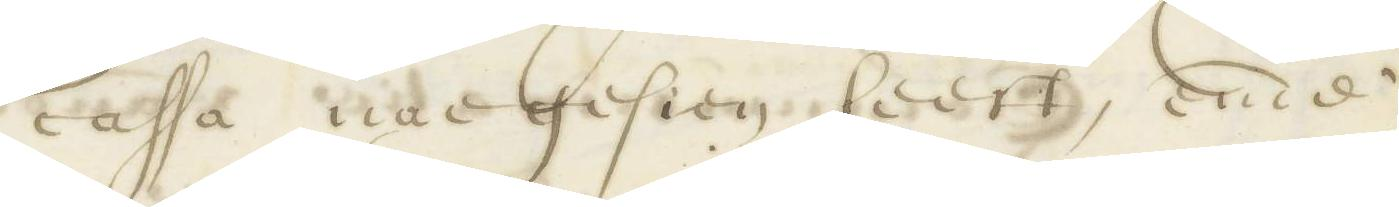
cassa naegesien heeft, ende
